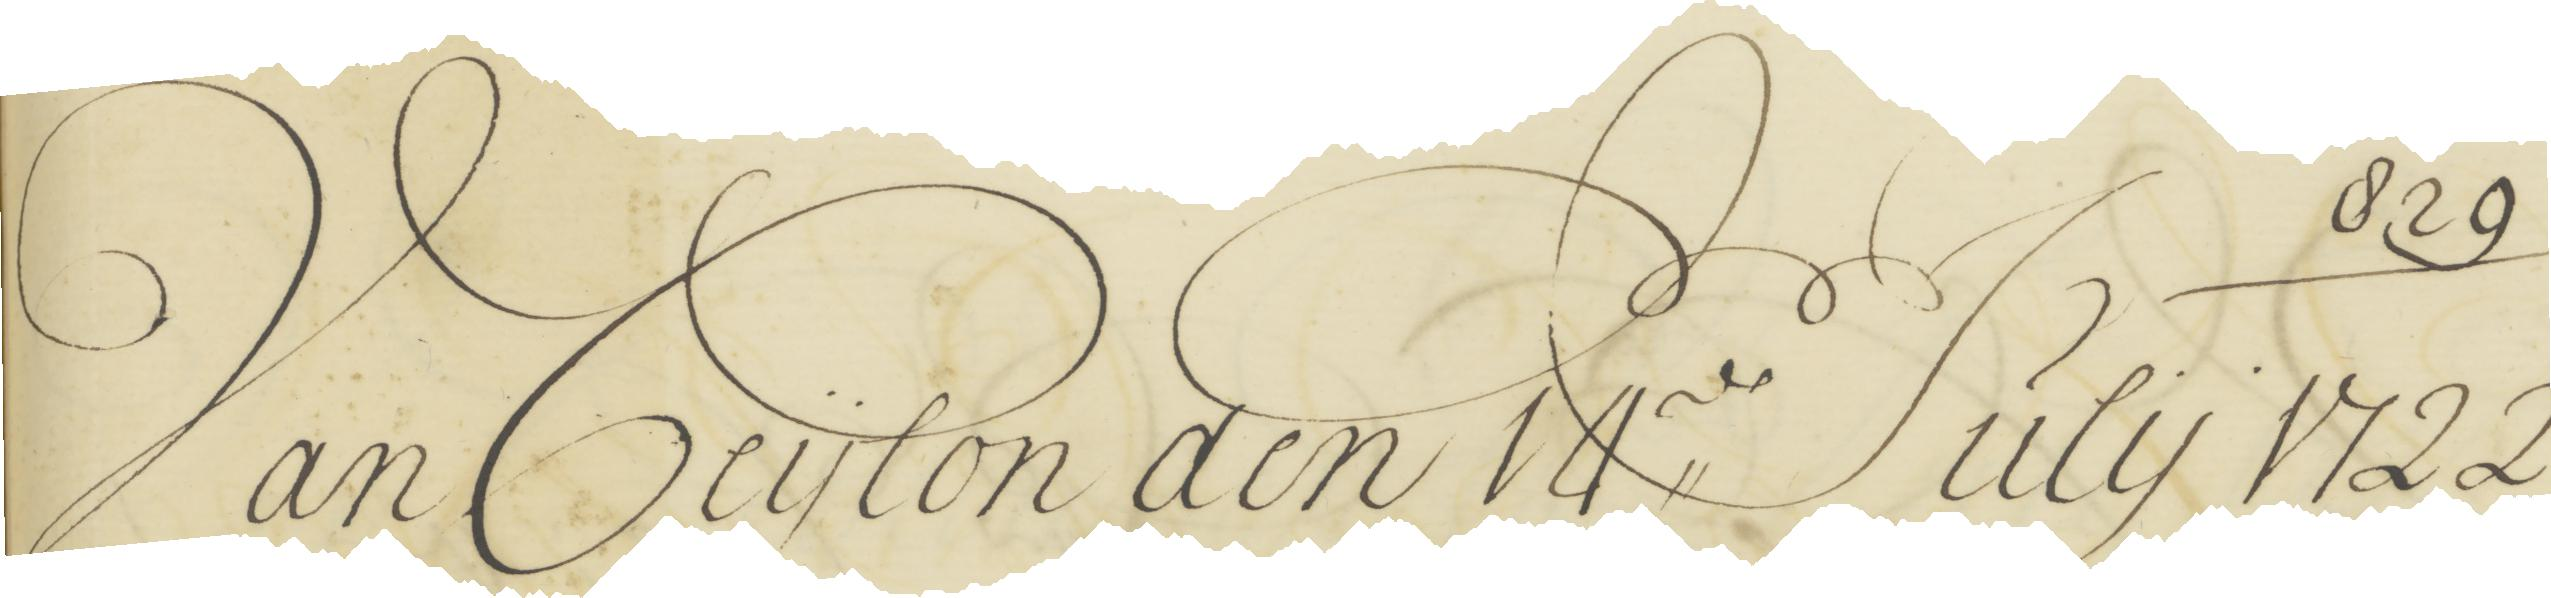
Van Ceijlon den 14„en Iulij 1722
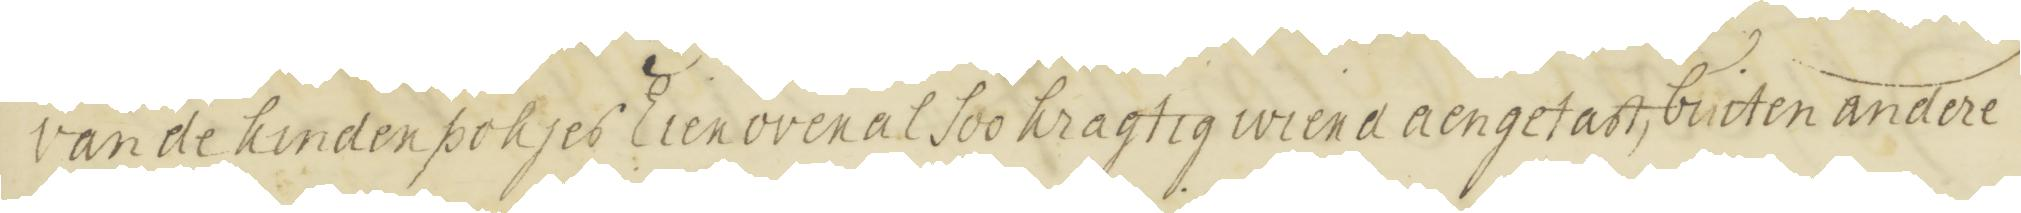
van de kinder pokjes hier overal soo kragtig wierd aengetast, buiten andere
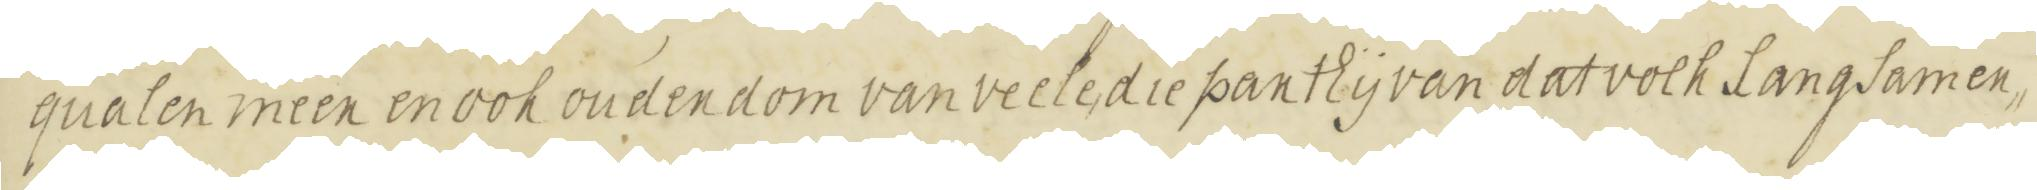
qualen meer en ook ouderdom van veele, die parthij van dat volk langsamer„
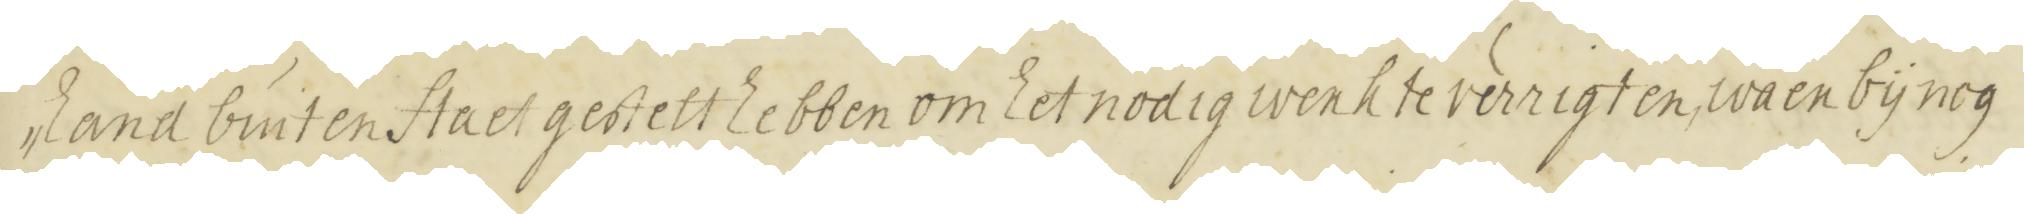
„hand buiten staet gestelt hebben om het nodig werk te verrigten, waer bij nog
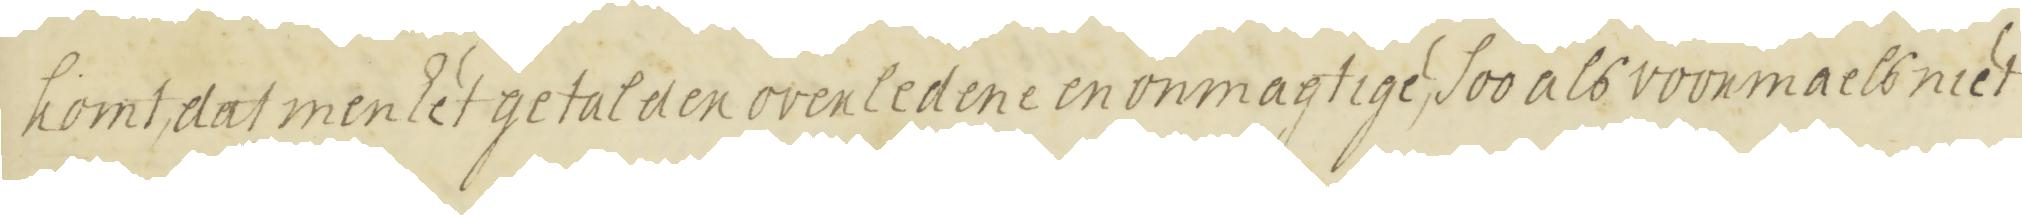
komt, dat men het getal der overledene en onmagtige, soo als voormaels niet
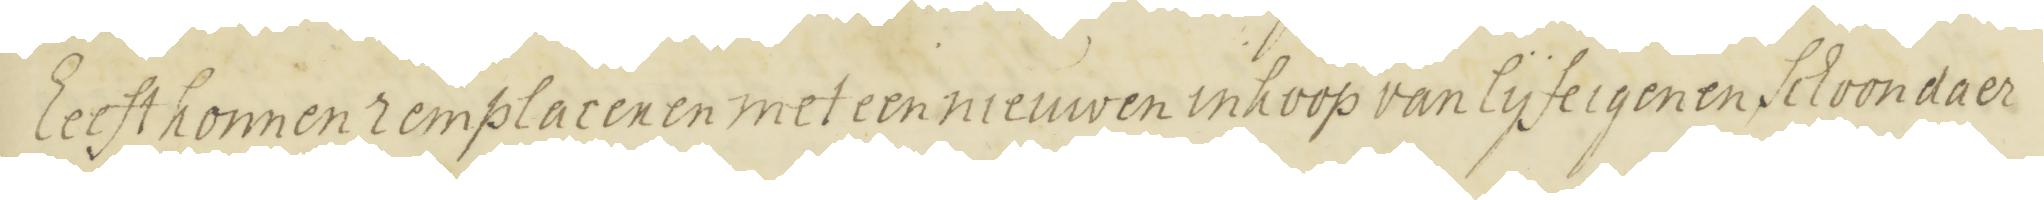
heeft konnen remplaceren met een nieuwen inkoop van lijfeigenen schoon daer
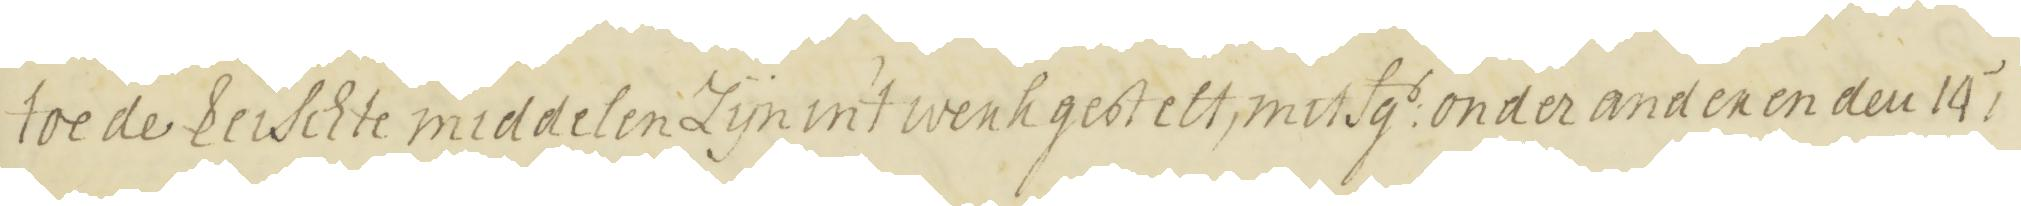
toe de vereischte middelen zijn in ’t werk gestelt, mitsg:s onder anderen den 14,'
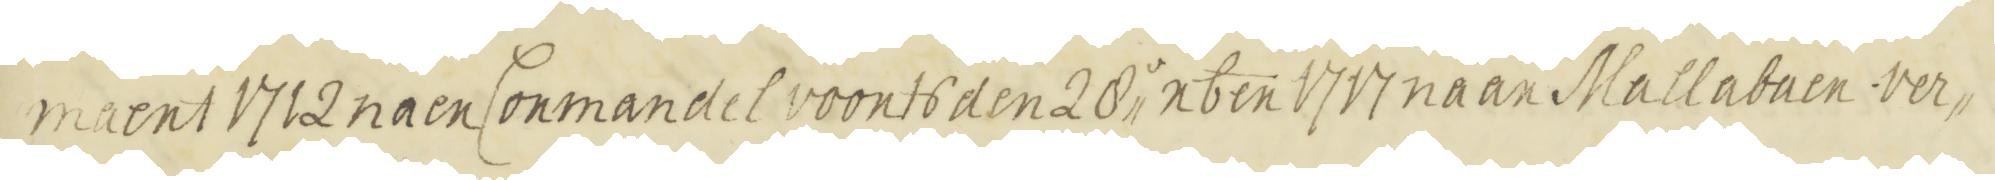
maert 1712 naer Cormandel voorts den 28„' xber 1717 naar Mallabaer ver„
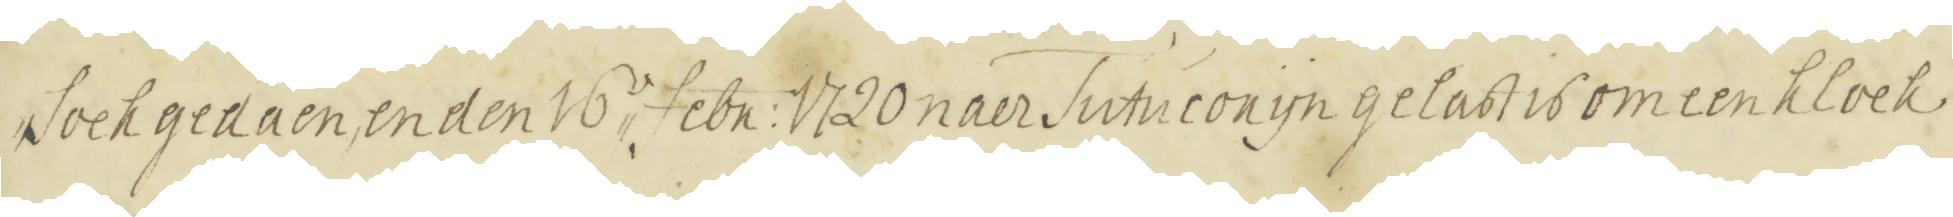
„soek gedaen, en den 16„e febr: 1720 naer Tutucorijn gelast is om een kloek
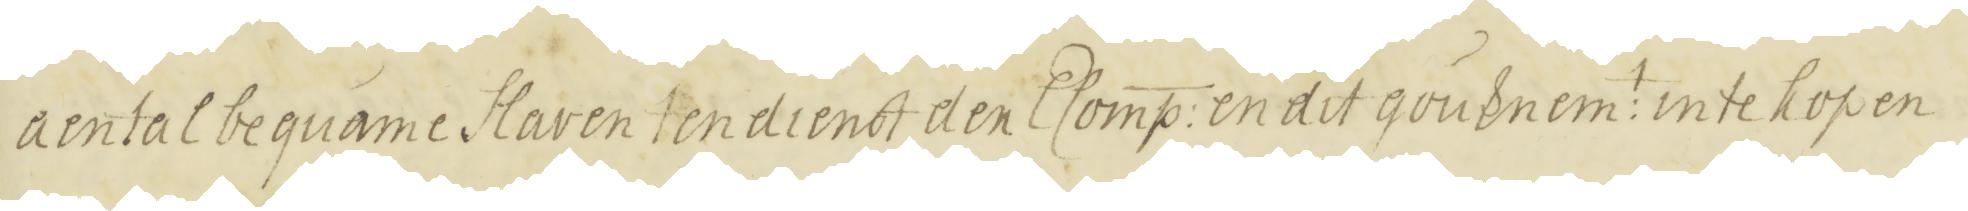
aental bequame slaven ten dienst der EComp: en dit gouvernem:t in te kopen
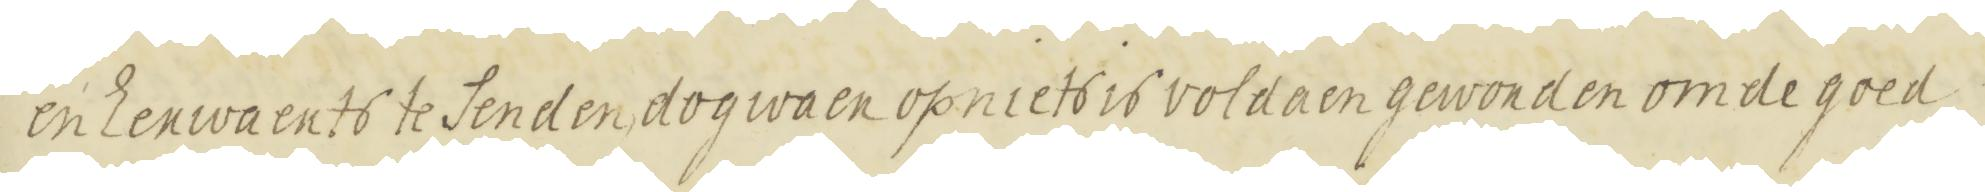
en herwaerts te senden, dog waer op niets is voldaen geworden om de goed
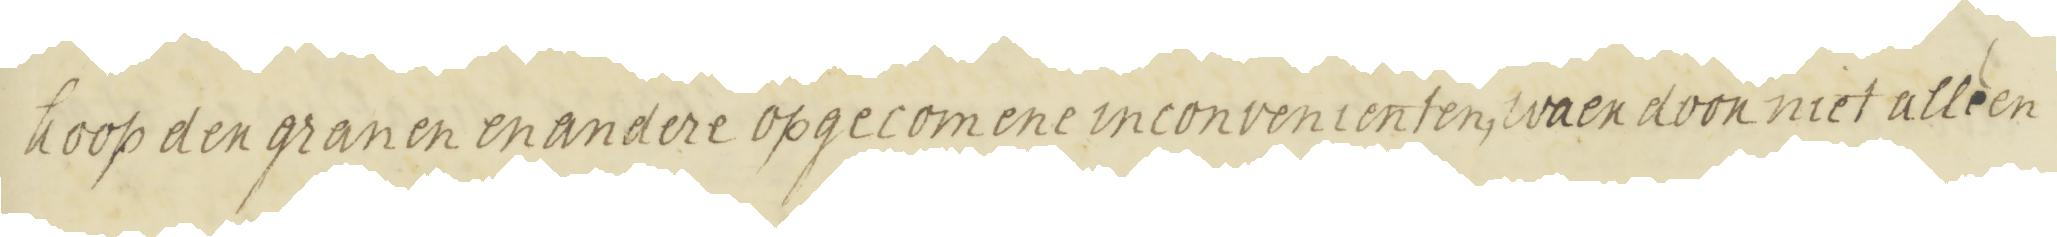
koop der granen en andere opgecomene inconvenienten, waer door niet alleen
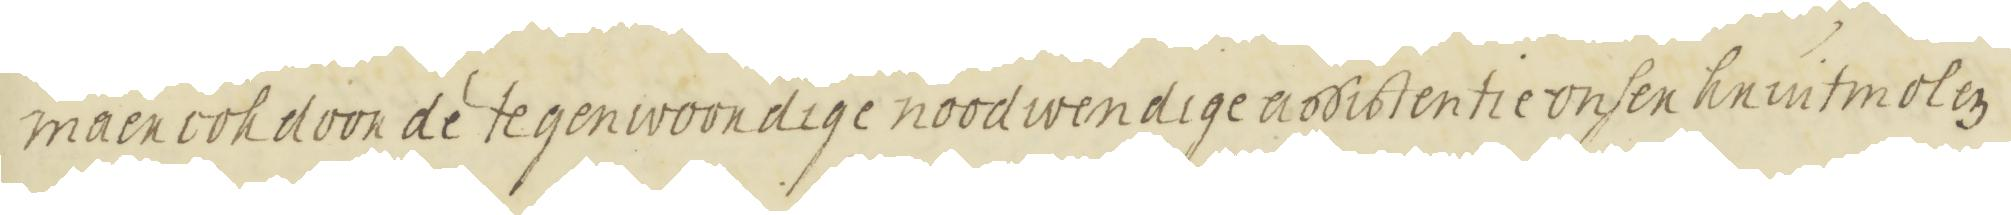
maer ook door de tegenwoordige noodwendige assistentie onser kruitmolen
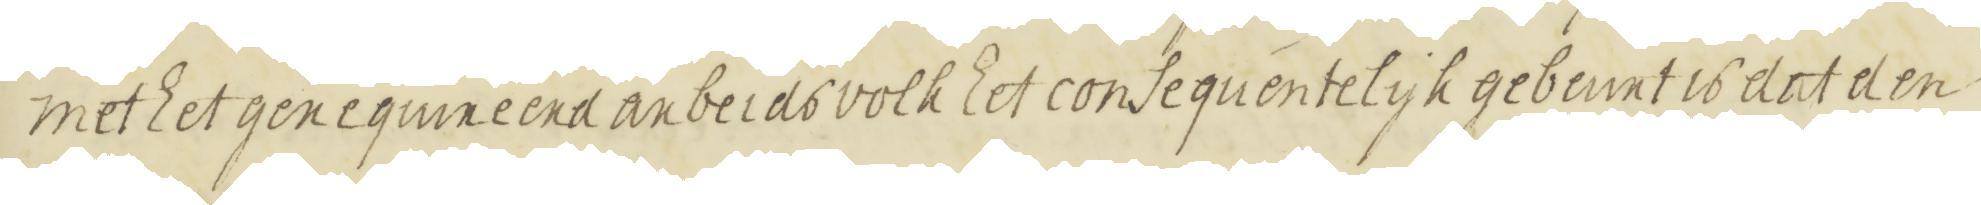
met het gerequireerd arbeidsvolk het consequentelijk gebeurt is dat den
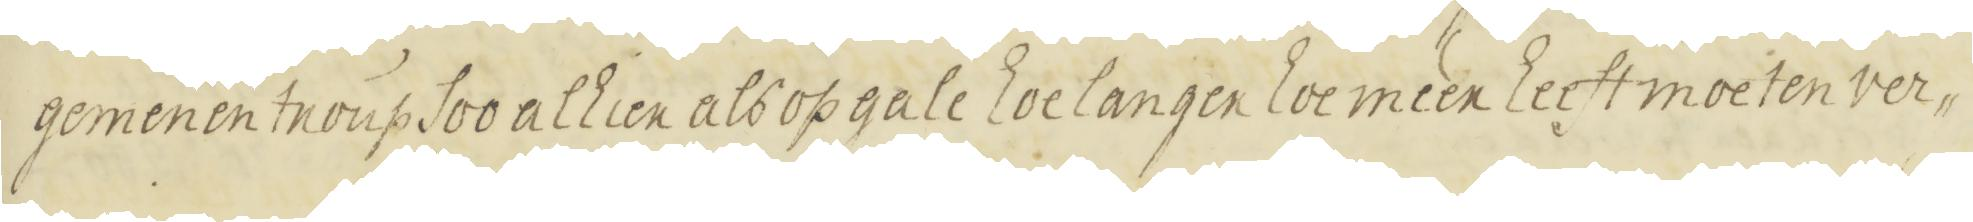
gemenen troup soo alhier als op gale hoe langer hoe meer heeft moeten ver„
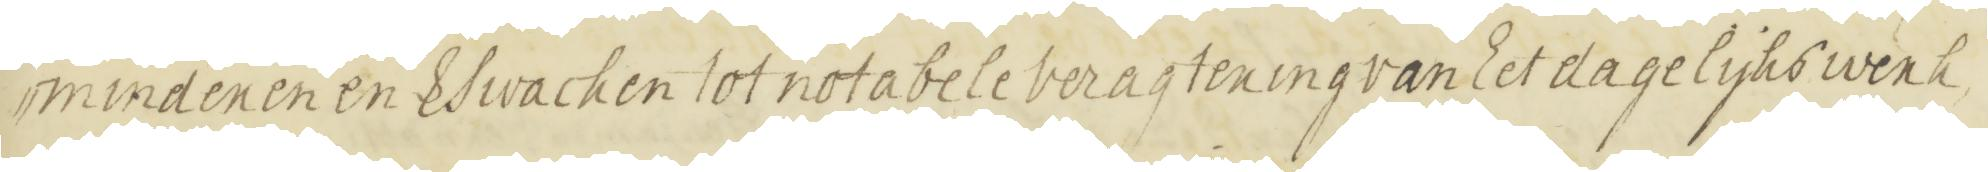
„minderen en verswacken tot notabele veragtering van het dagelijks werk,
